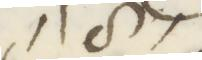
/ 8 /
